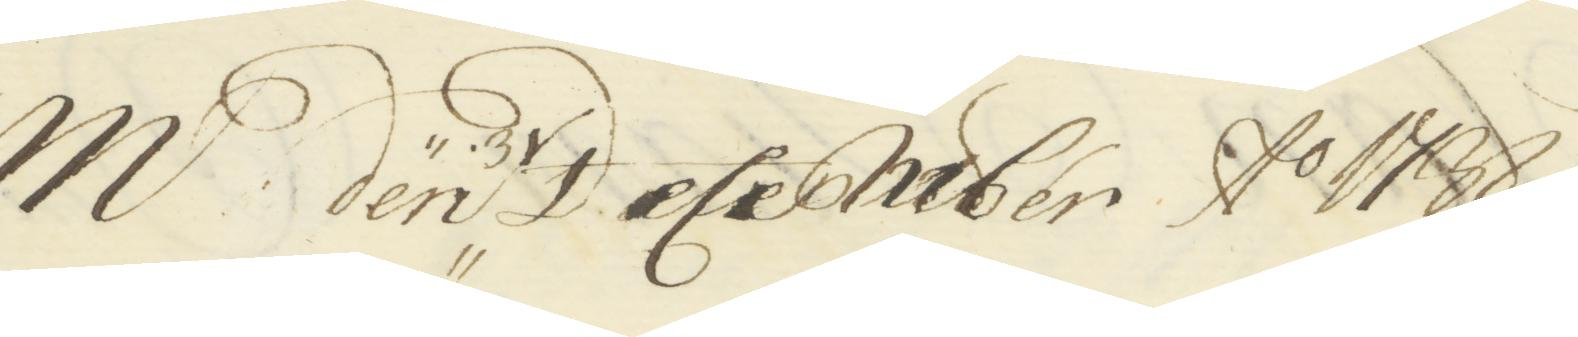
Van Siam den „ December Ao 1738.
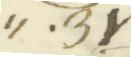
„ .31
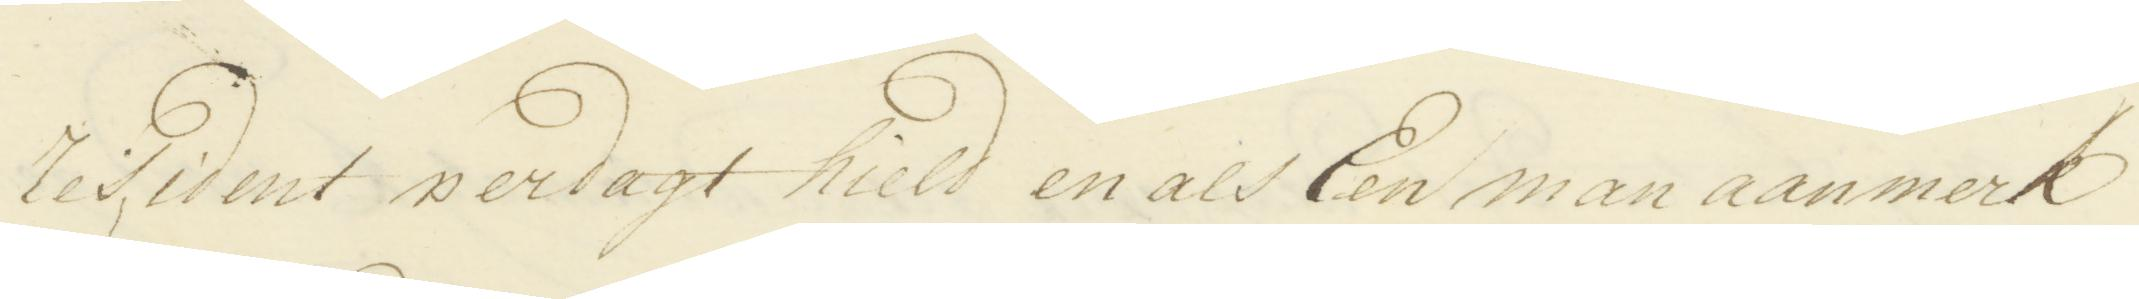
resident verdagt hield en als Een man aanmerk
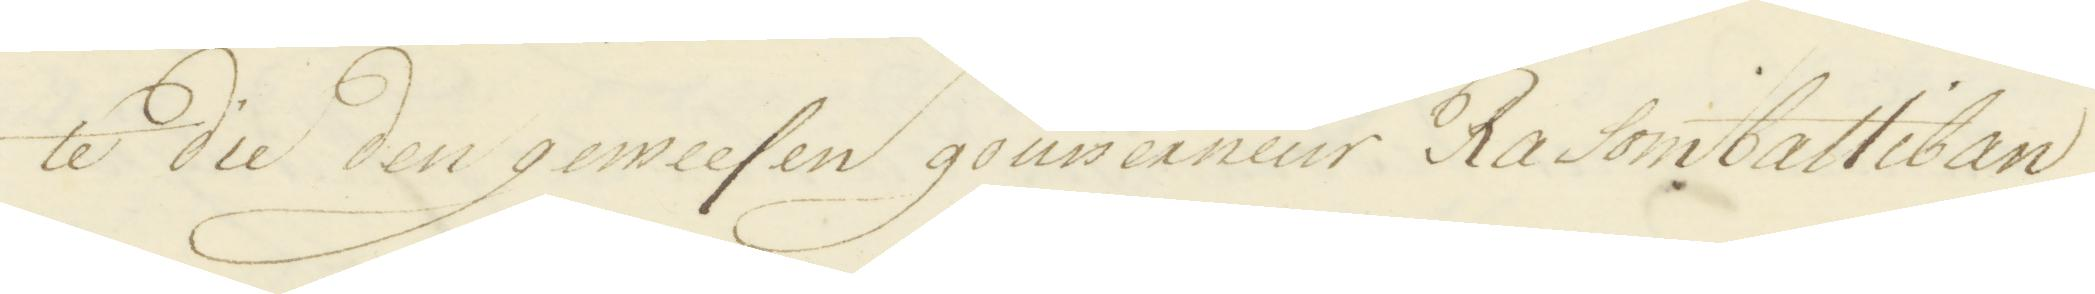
te die den geweesen gouverneur Rasombattiban
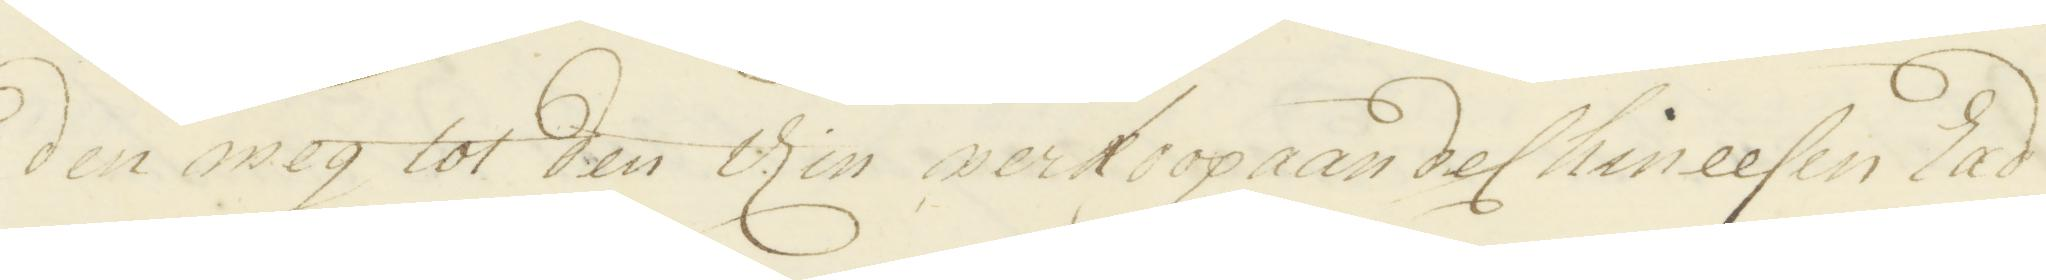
den weg tot den thin verkoop aan de Chineesen had
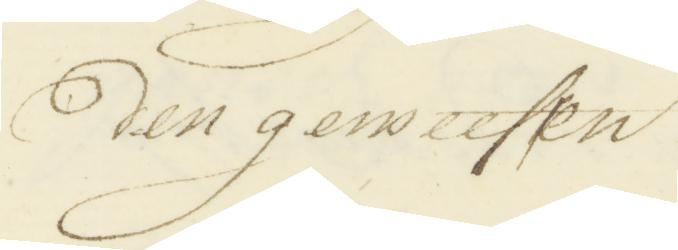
den geweesen
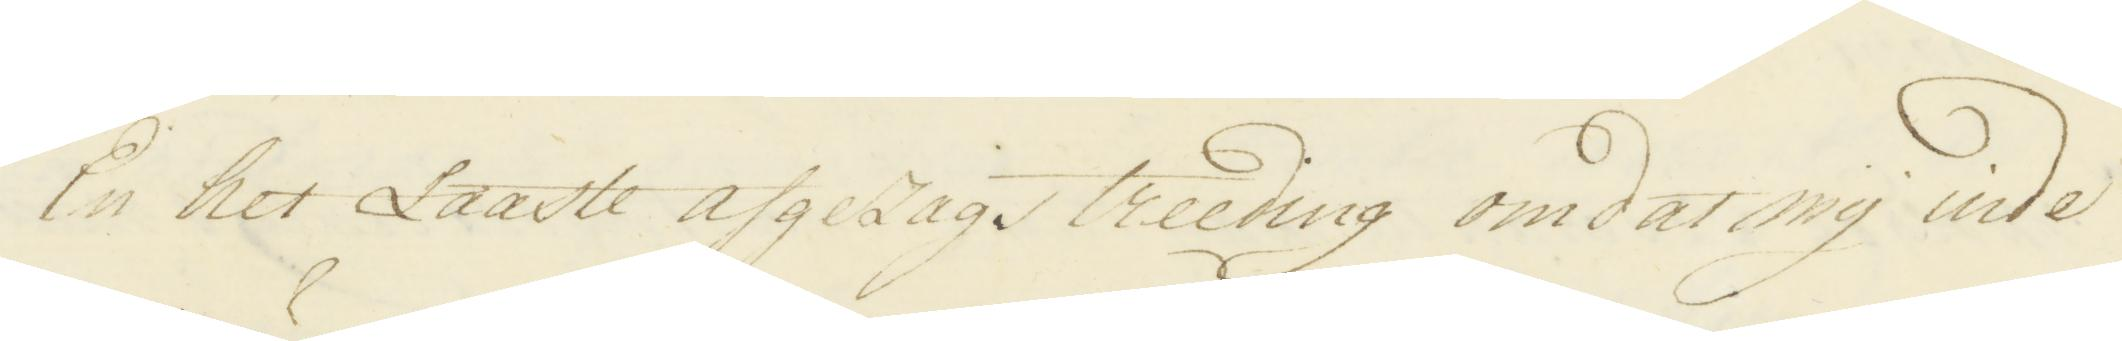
En het Laaste afgezags treeding omdat wij inde
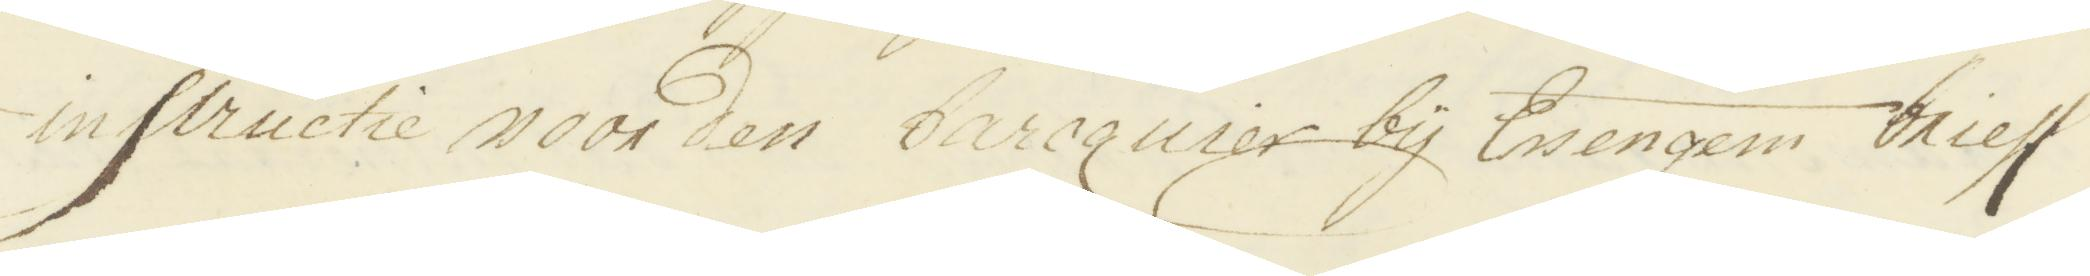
instructie voor den barcquier bij Evengem brieff
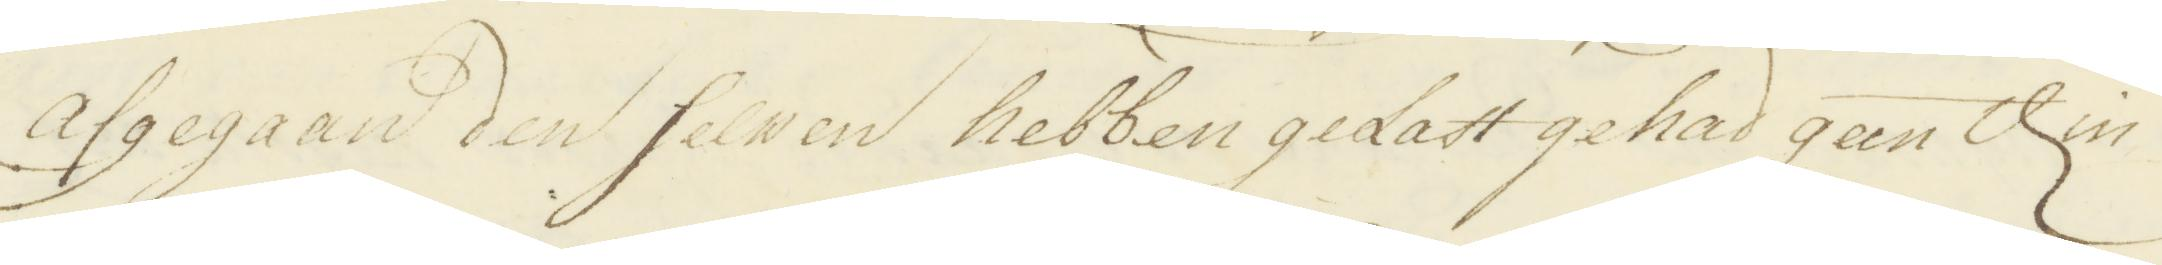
afgegaan den selven hebben gelast gehad geen thin
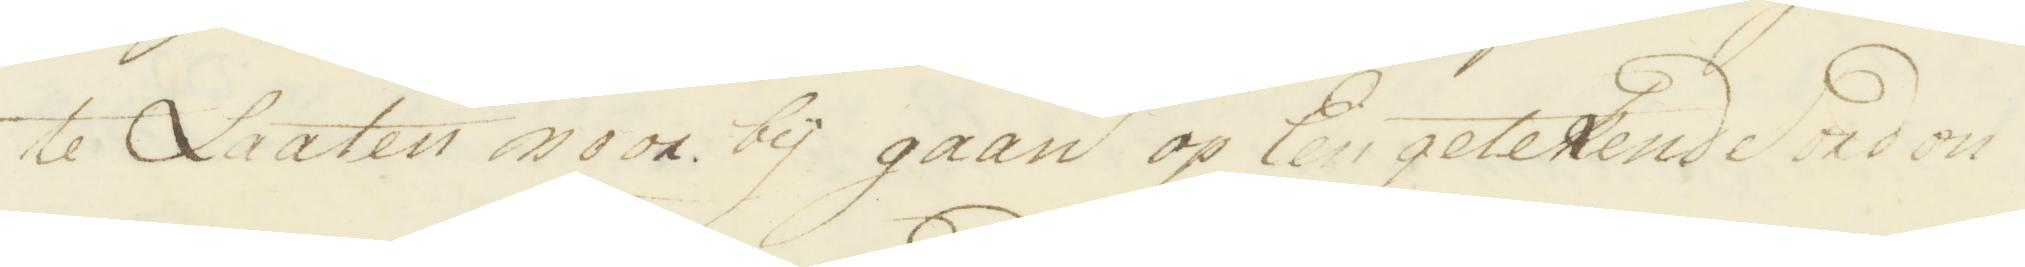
te Laaten voor bij gaan op Een getekende ordon
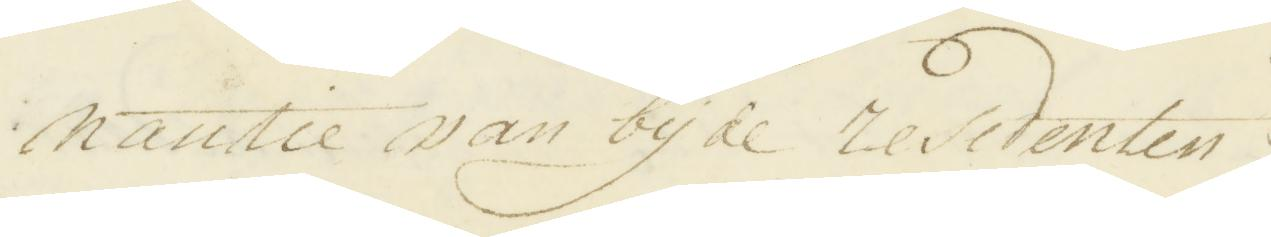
nantie van bij de residenten
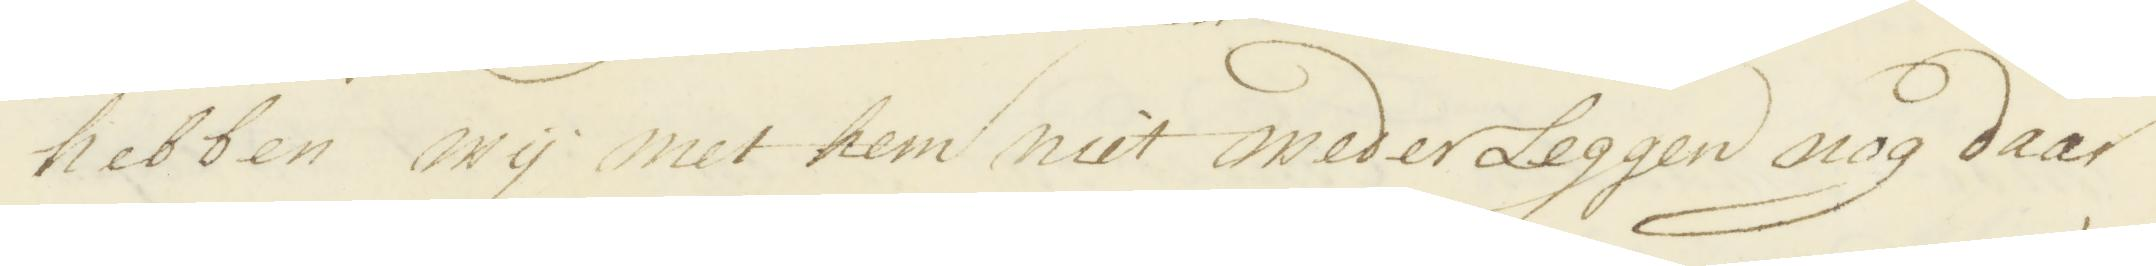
hebben wij met hem niet wederleggen nog daar
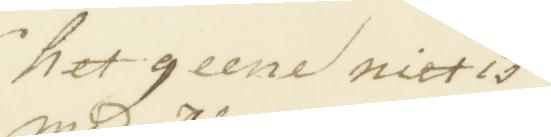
het geene niet is
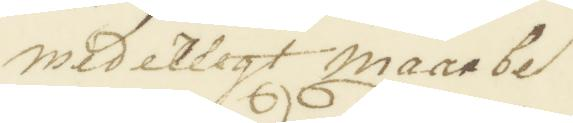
wederlegt maar be
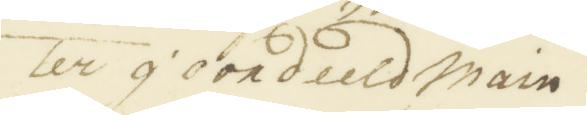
ter g’oordeeld main
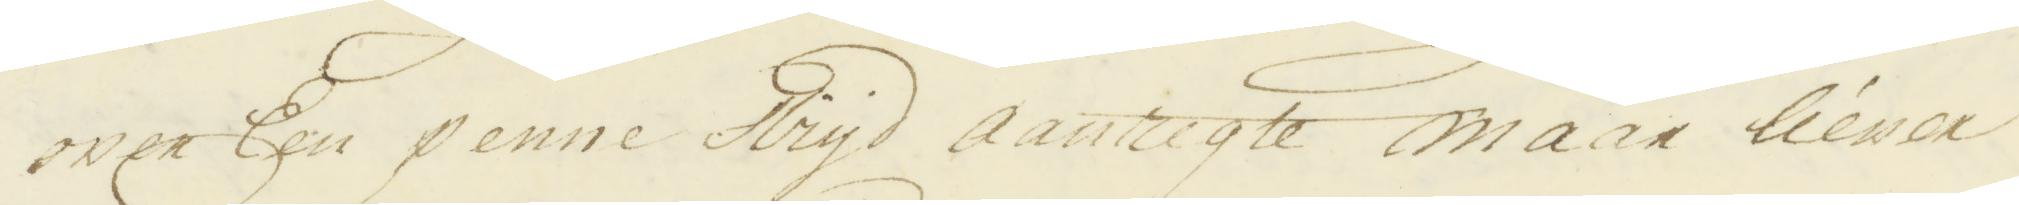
over Een penne strijd aanregte maar liever
